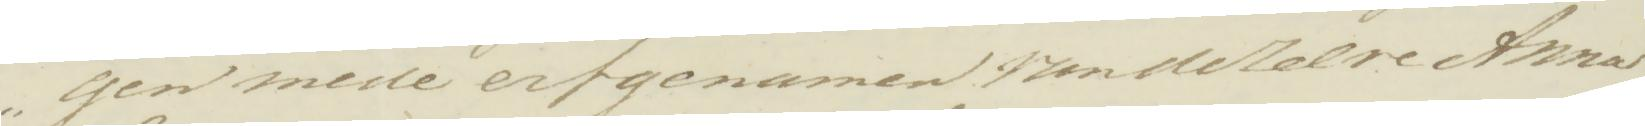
„gen mede erfgenamen van dezelve Anna
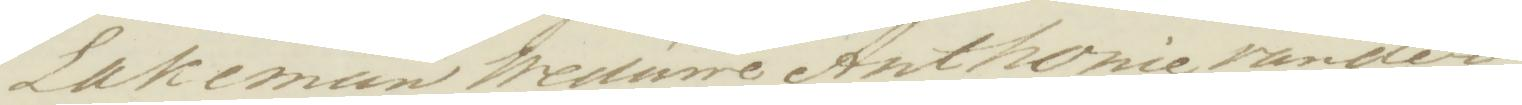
Lakeman weduwe Anthonie van der
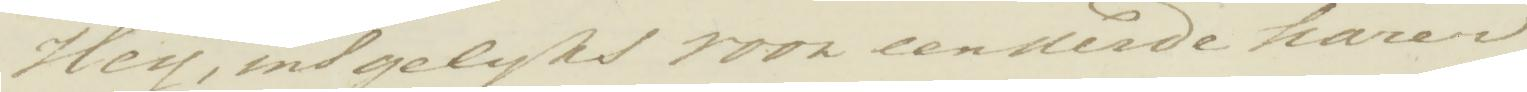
Hey, insgelyks voor een derde harer
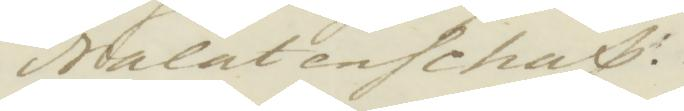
Nalatenschap:
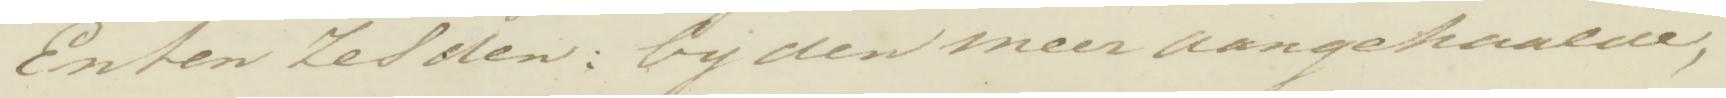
En ten zesden: bij den meer aangehaalde,
